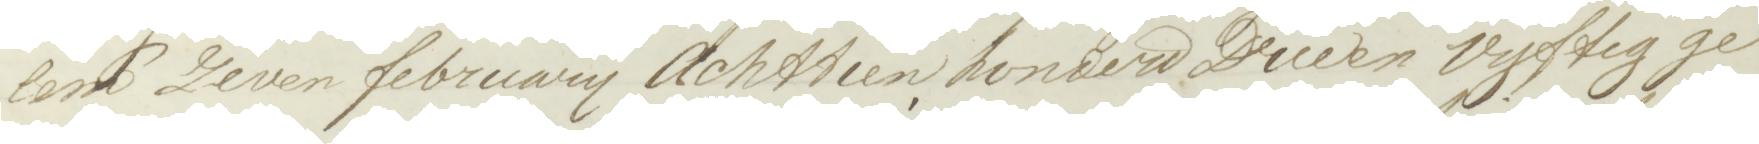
lem Zeven february Achttien honderd Drie en vyftig ge
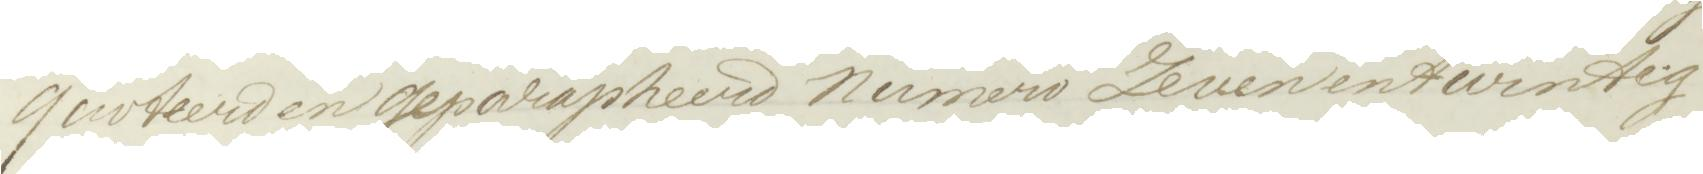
quoteerd en geparapheerd Numero Zeven en twintig
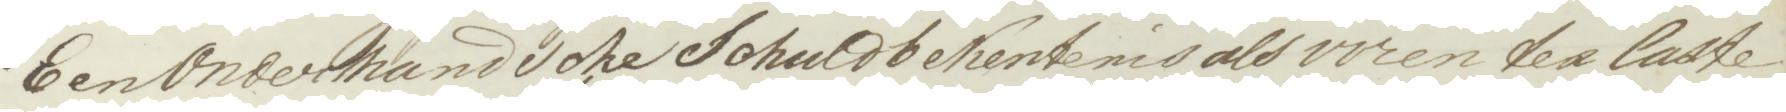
Een onderhandsche Schuldbekentenis als voren ter laste
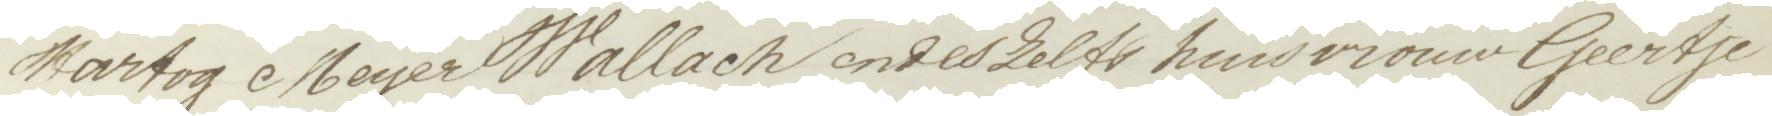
Hartog Meijer Wallach en deszelfs huisvrouw Geertje
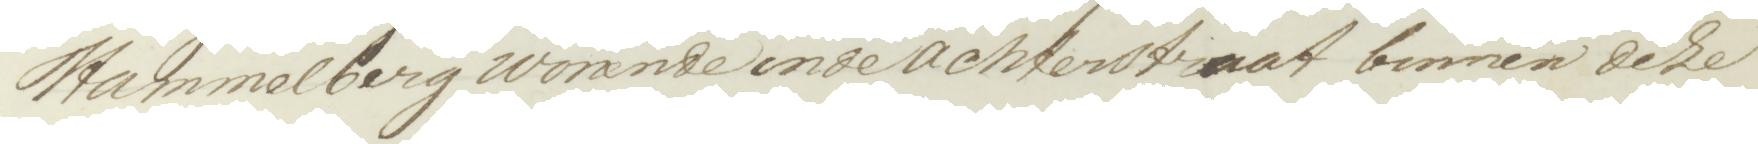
Hammelberg wonende inde achterstraat binnen deze
